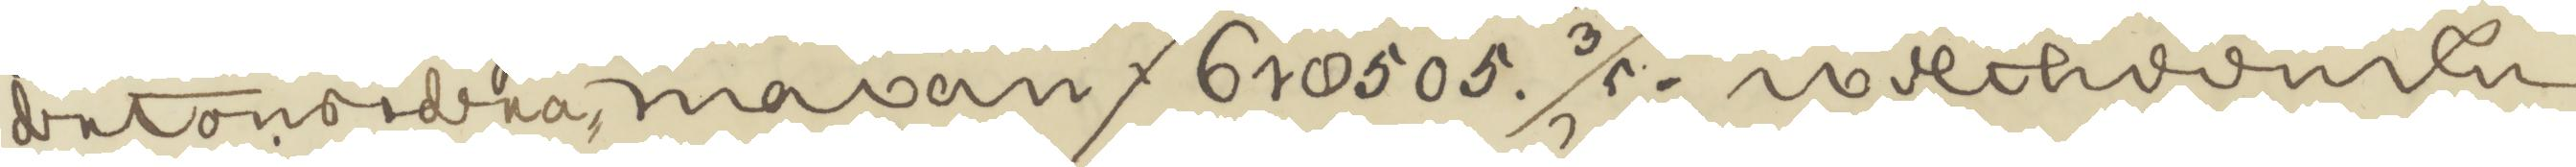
der considera„ ma van ƒ618505.3/5. welck een en
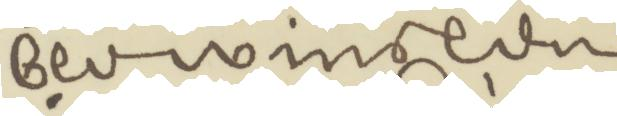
ble winsten
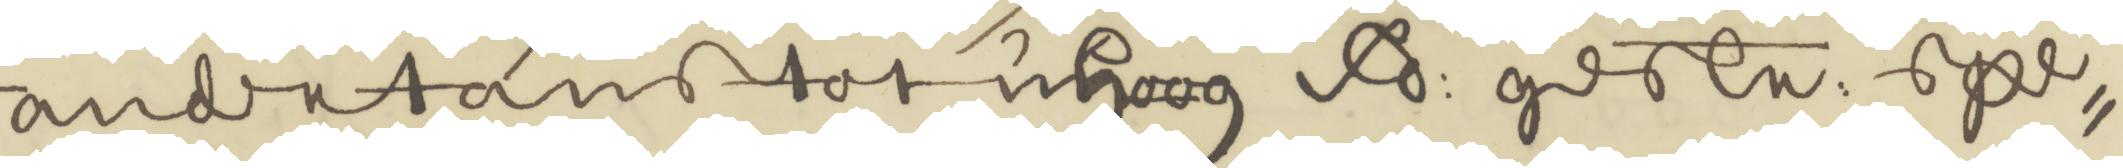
ander tans tot uhoog Ed: gestr: spe„
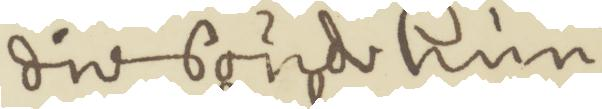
die soude kun
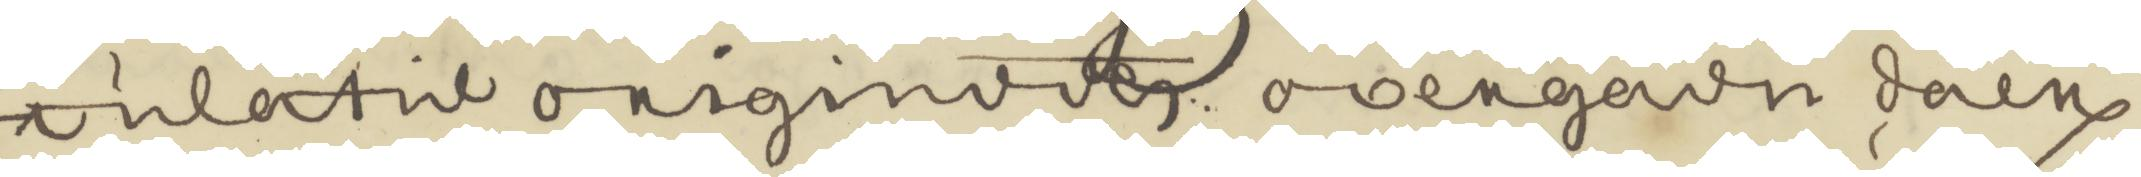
culatie origineelen overgaen daer
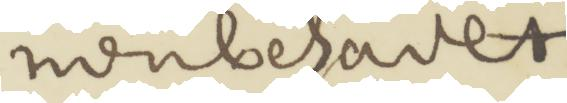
nen behaelt
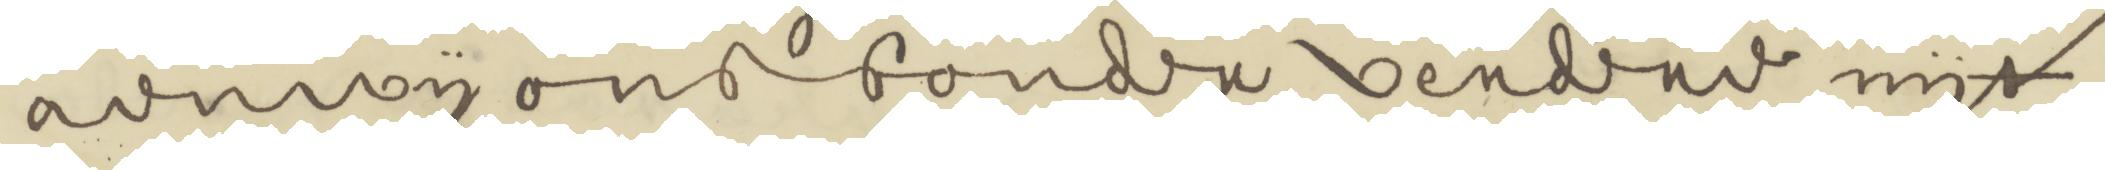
aen wij ons sonder verdere uijt
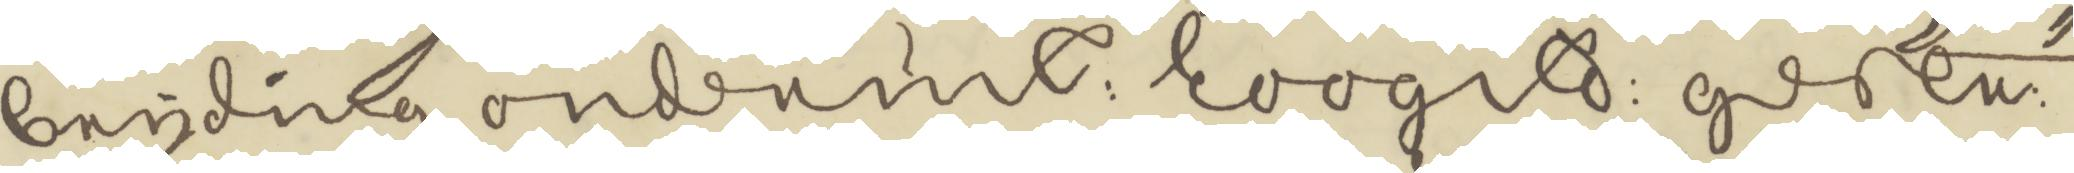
brijding onder uE: hoogEd: gestr:
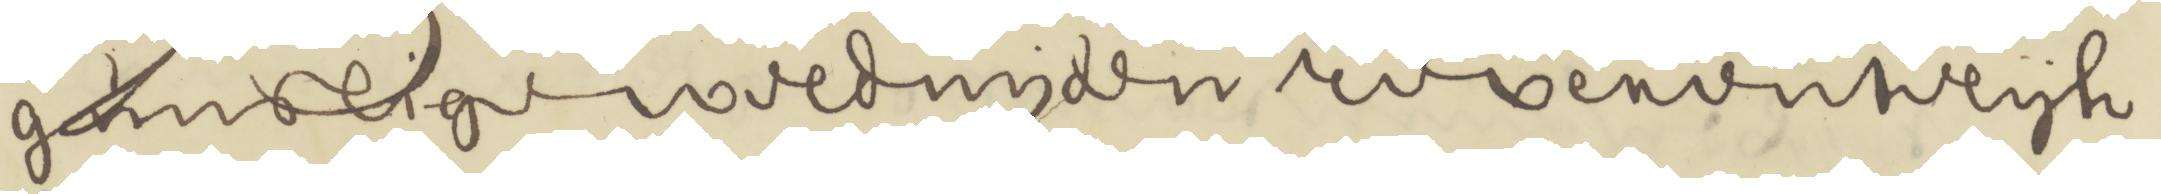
gunstige welduijden reverentelijk
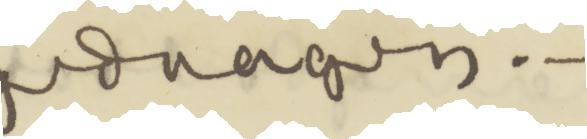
gedragen.—
